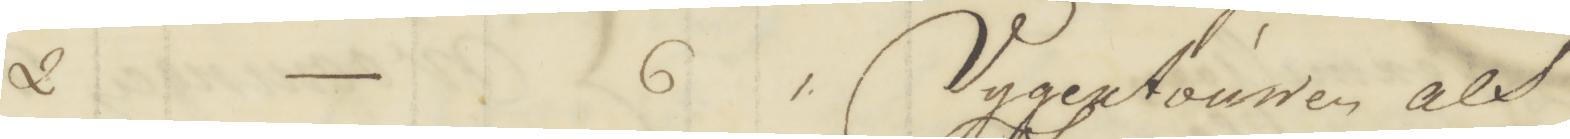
2 — 6 „ Vygertouwen als
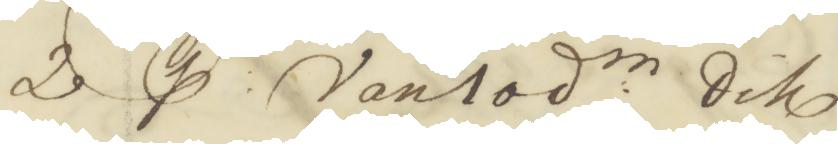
2 p:s van 10 d:m dik
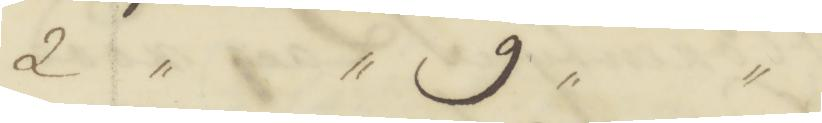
2 „ „ 9 „ „
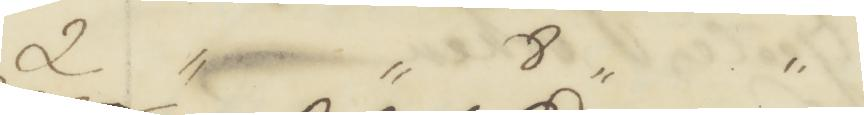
2 „ „ 8 „ „
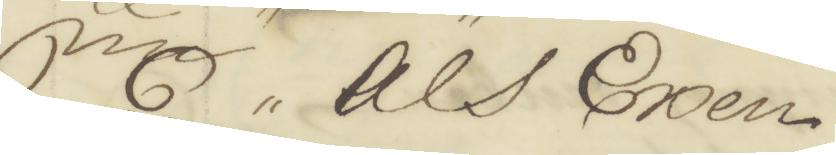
als Even
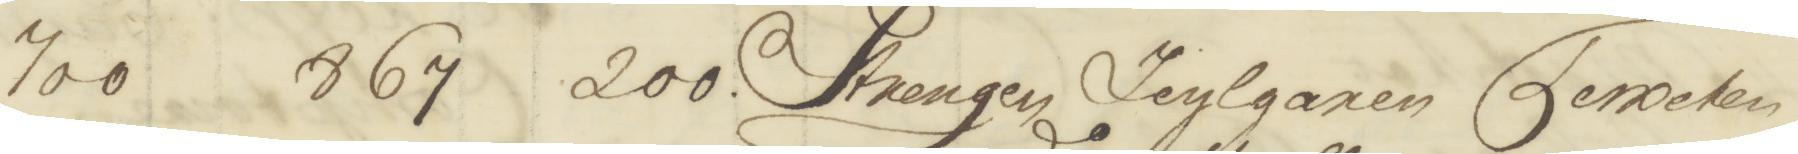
700 867 200. Strengen Zeylgaren Te weten
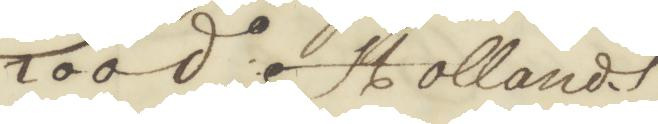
100 d:o Hollands
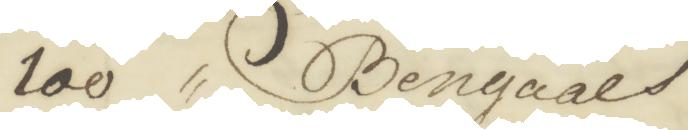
100 „ Bengaals
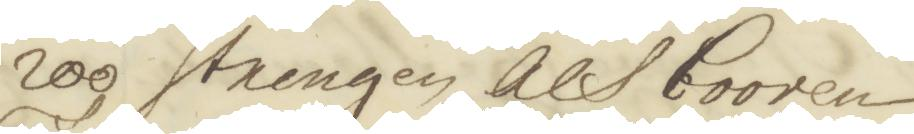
200 Strengen als booven
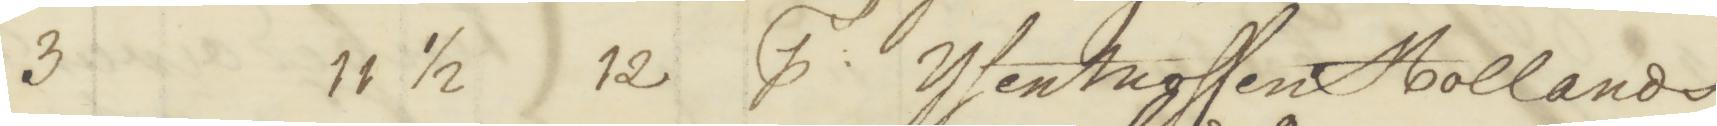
3 11 ½ 12 p:s Ysertrossen Hollands
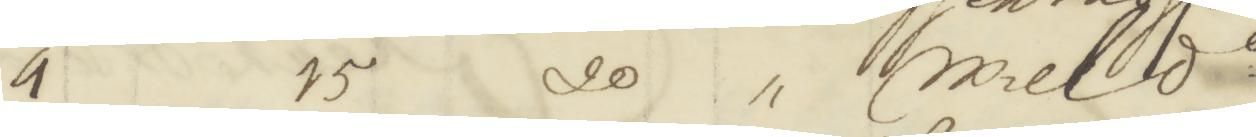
4 15 20 „ met d:o _:o
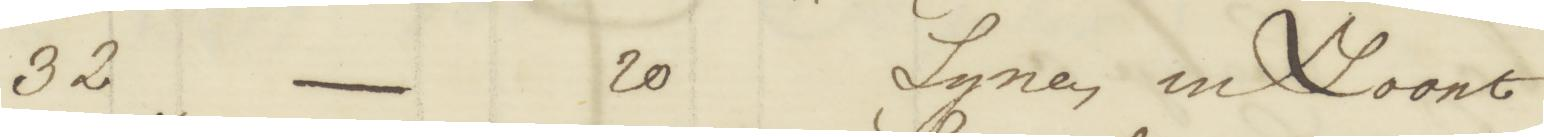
32 — 20 Lynen in Zoort
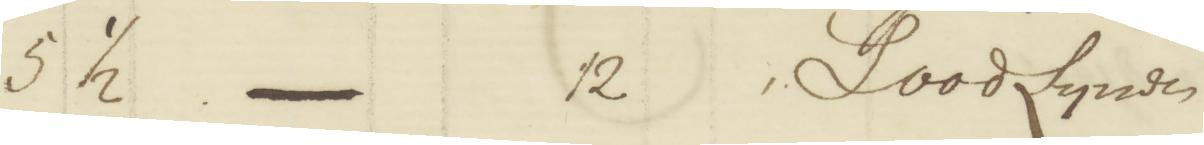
5 ½ — 12 „ Lood Lynen
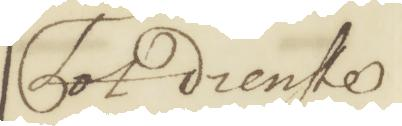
Tot dienste
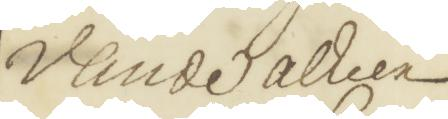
Vande alhier
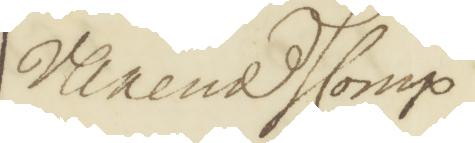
Varende SComp
